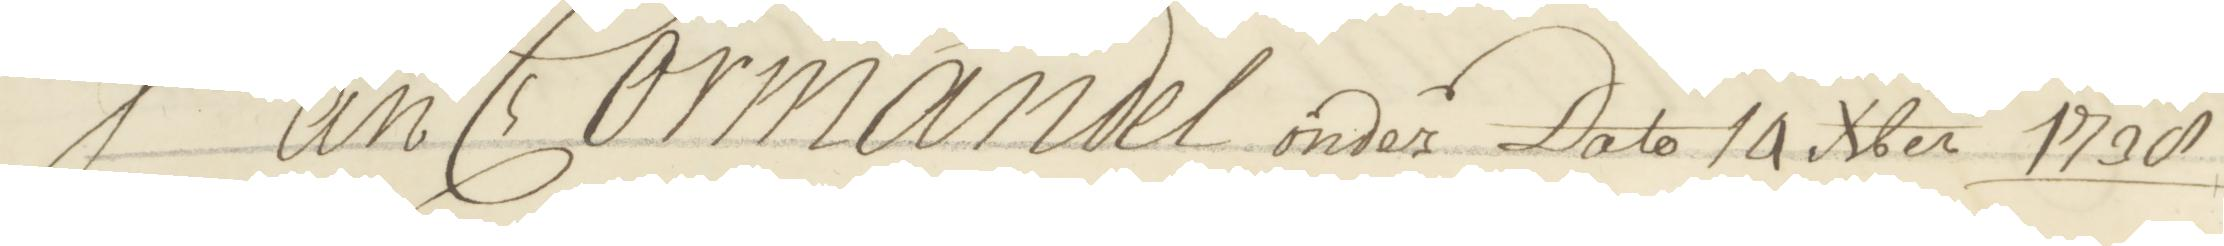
Van Cormandel onder Dato 14 xber 1738
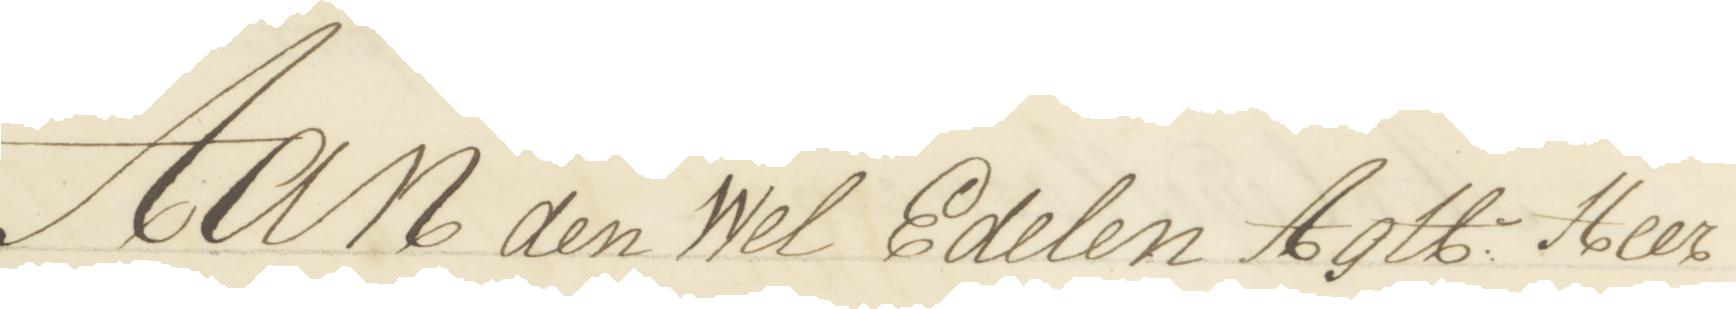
Aan den Wel Edelen Agtb: Heer
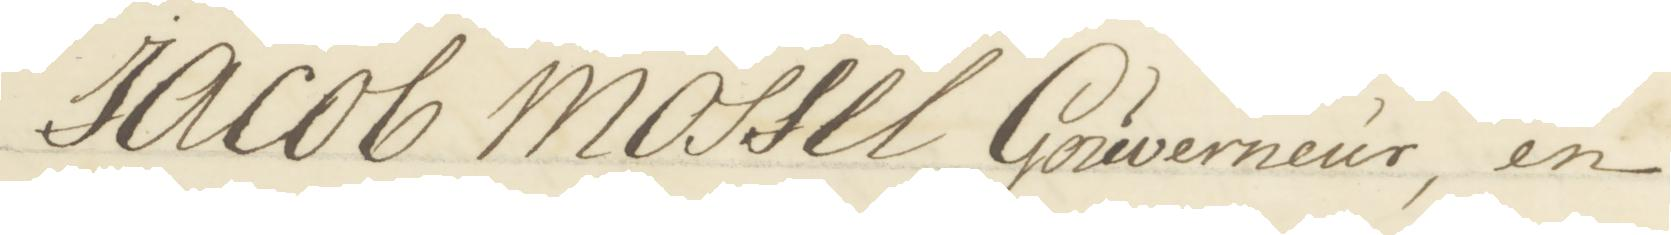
Iacob Mossel Gouverneur, en
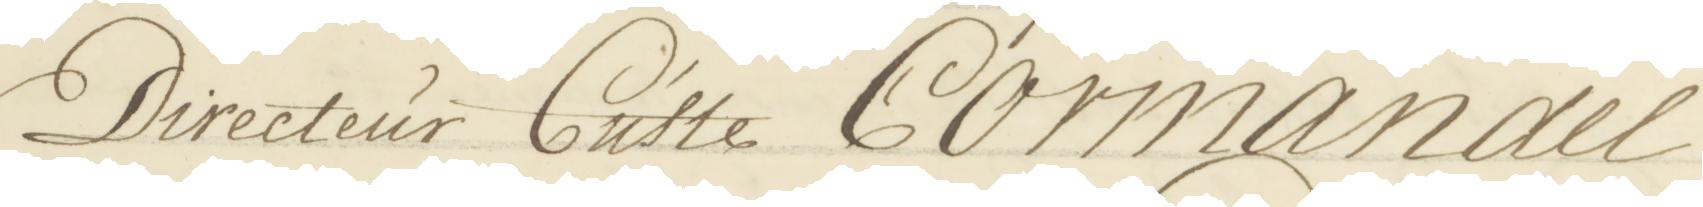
Directeur Custe Cormandel
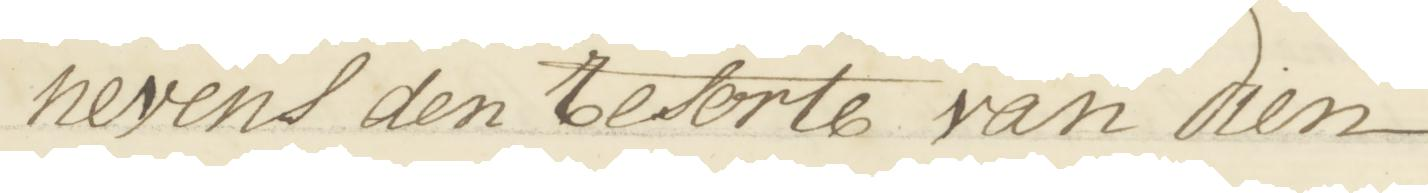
nevens den resorte van dien
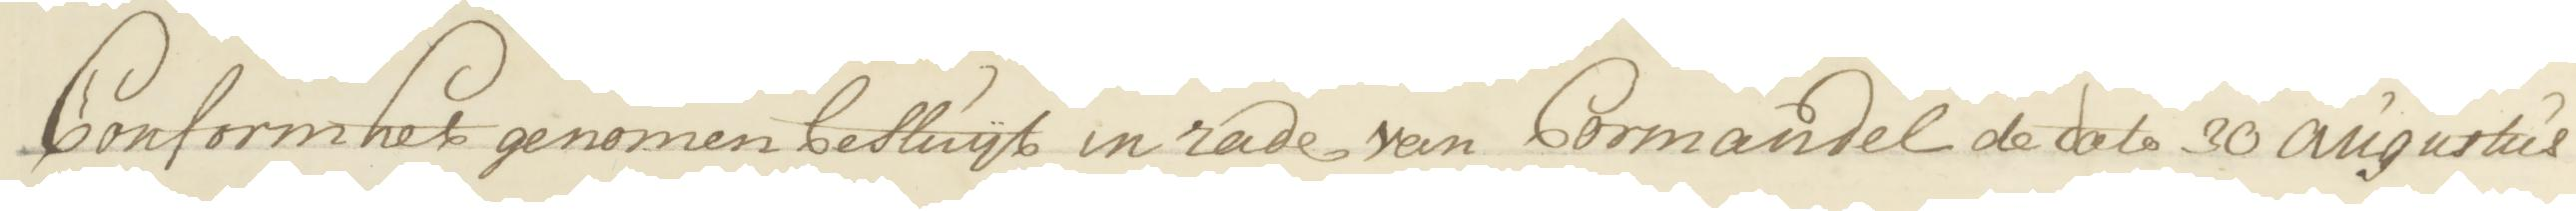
Conform het genomen besluijt in rade van Cormandel de dato 30 augustus
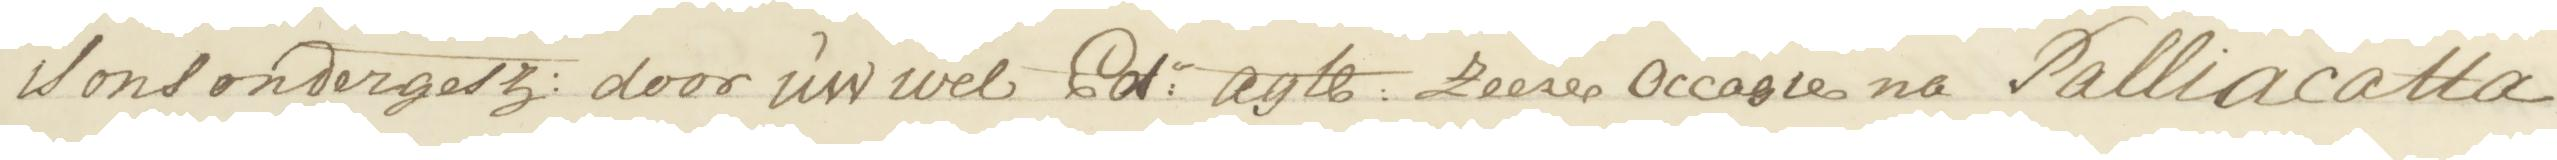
is ons ondergesz: door uw wel Ed: agtb: Zeere Occasie na Palliacatta
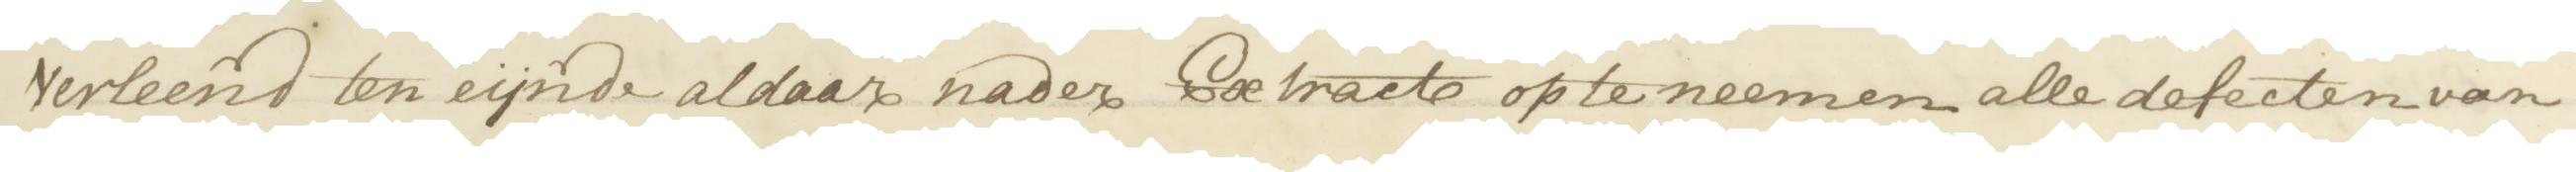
verleend ten eijnde aldaar nader Extract op te neemen alle defecten van
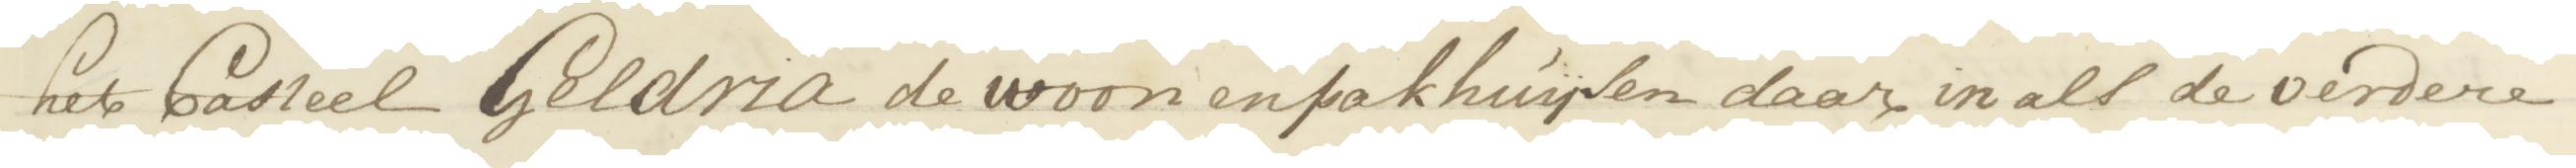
het Casteel Geldria de woon enpakhuijsen daar in als de verdere
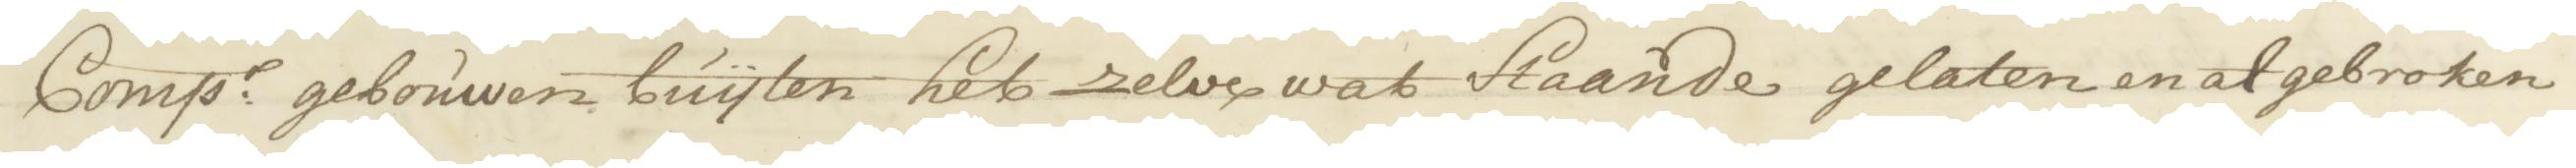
Comp:s gebouwen buijten het zelve wat staande gelaten en afgebroken
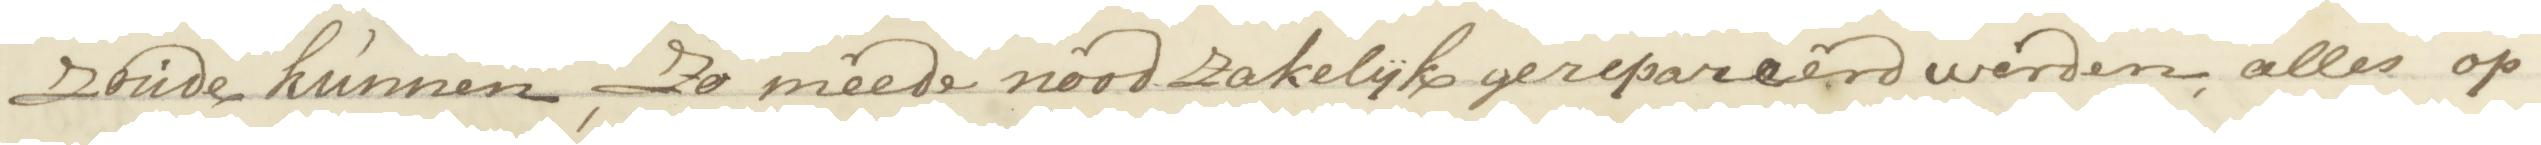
zoude kunnen, zo meede nood zakelijk gerepareerd werden, alles op
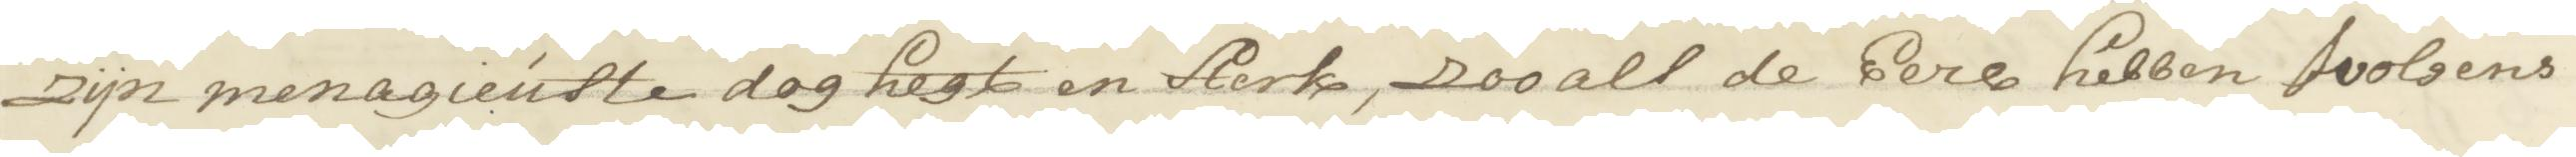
zijn menagieuste dog hegt en sterk, zoo als de Eere hebben vervolgens
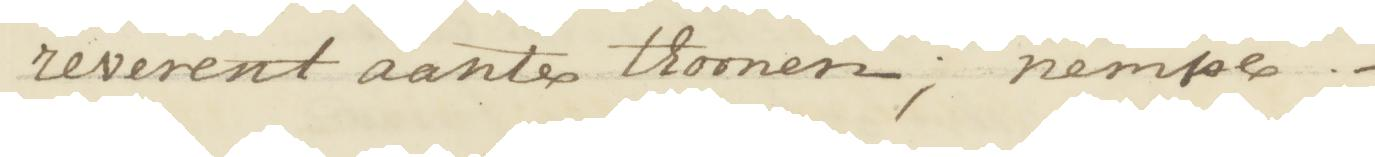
reverent aante thoonen; nempe.
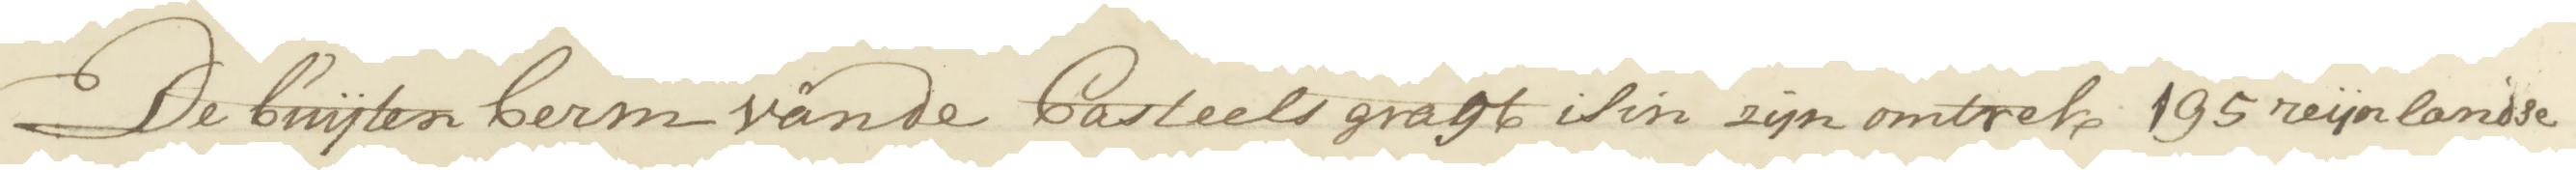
De buijten berm vande Casteels gragt is in zijn omtrek 195 reijnlandse
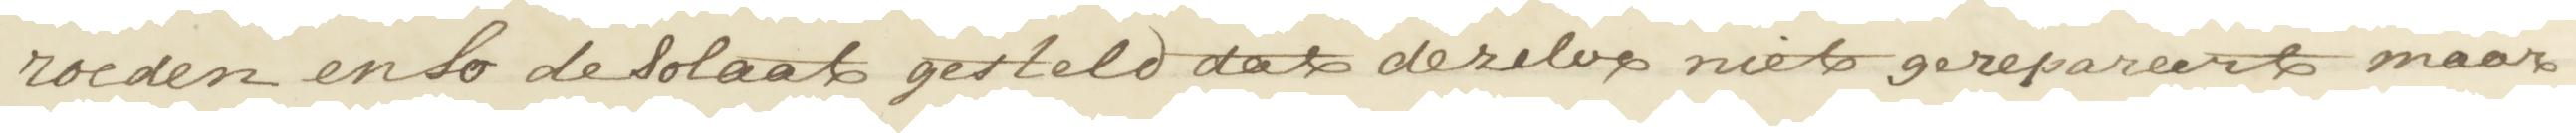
roeden en so de solaat gesteld dat dezelve niet gerepareert maar
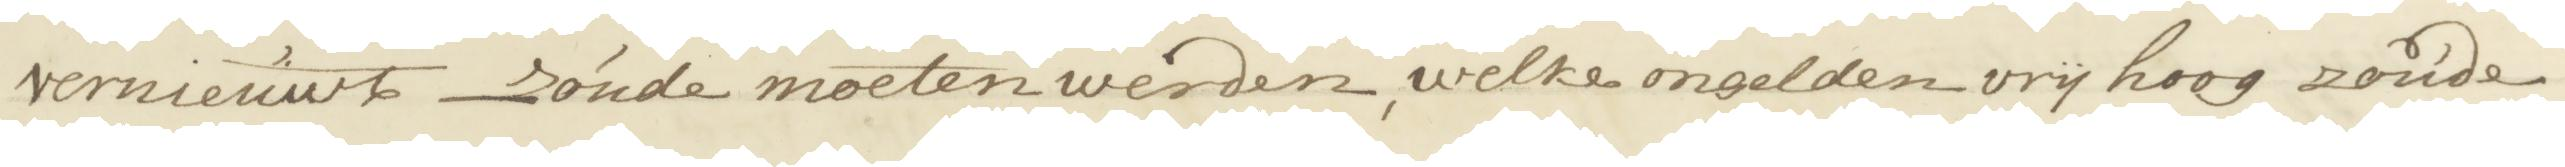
vernieuwt zoude moeten werden, welke ongelden vrij hoog zoude
